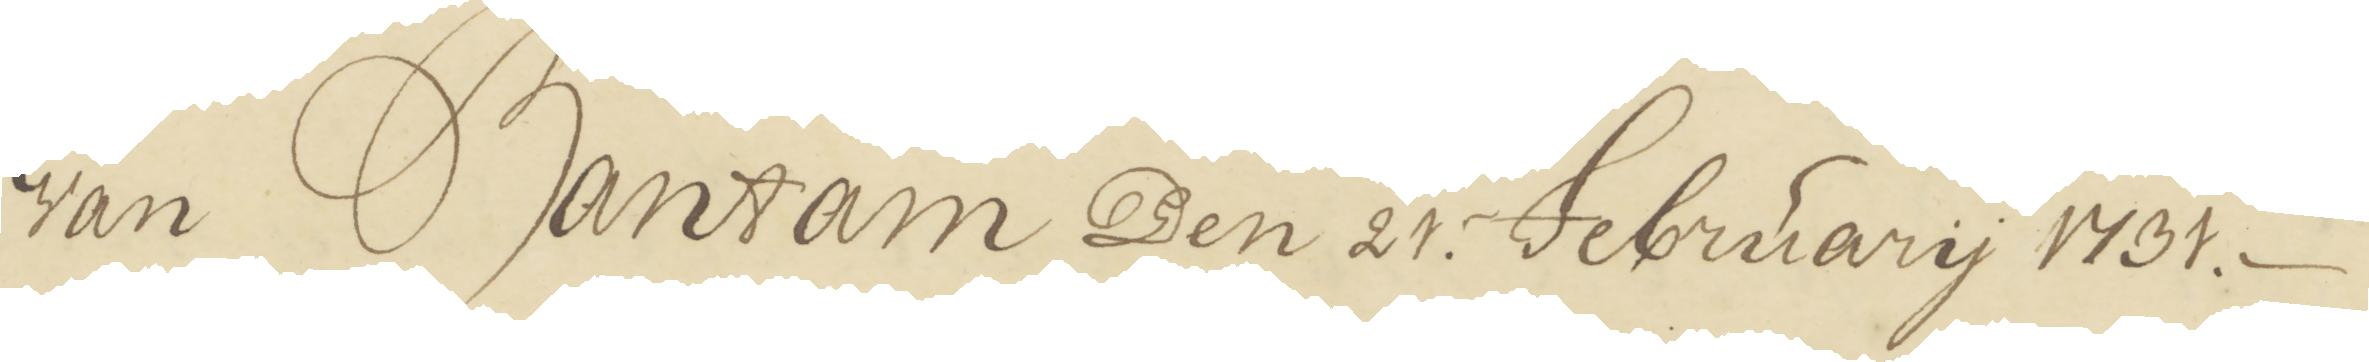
Van Bantam Den 21:e Februarij 1731. —
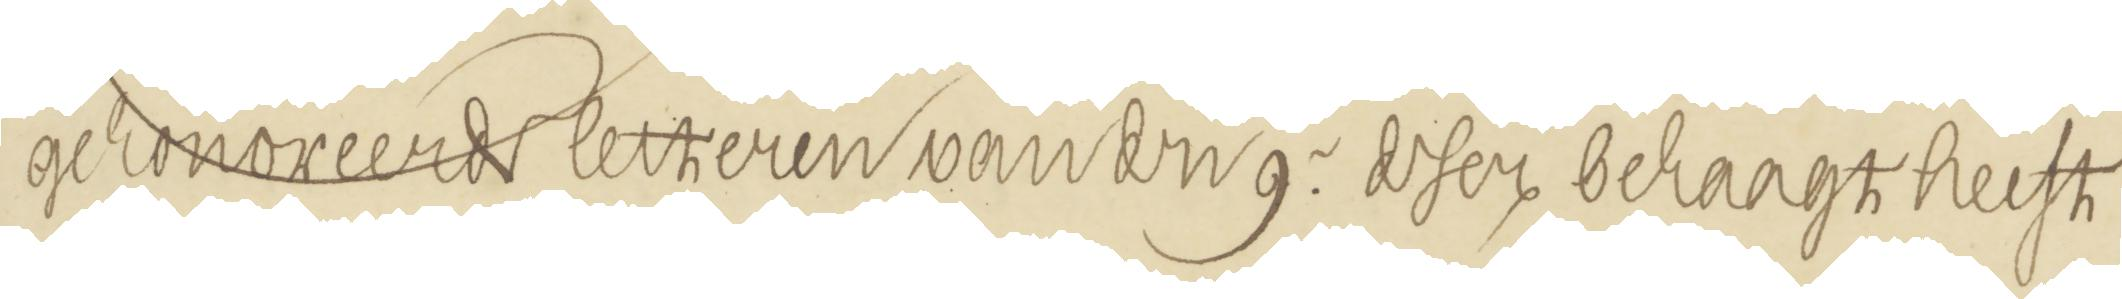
gehonoreerde letteren van den 9:e deser behaagt heeft
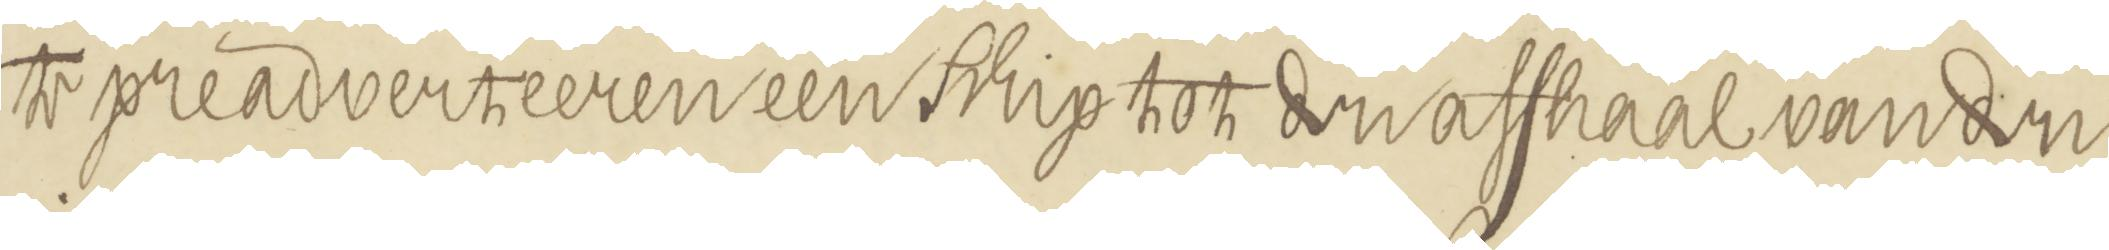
te preadverteeren een schip tot den affhaal van den
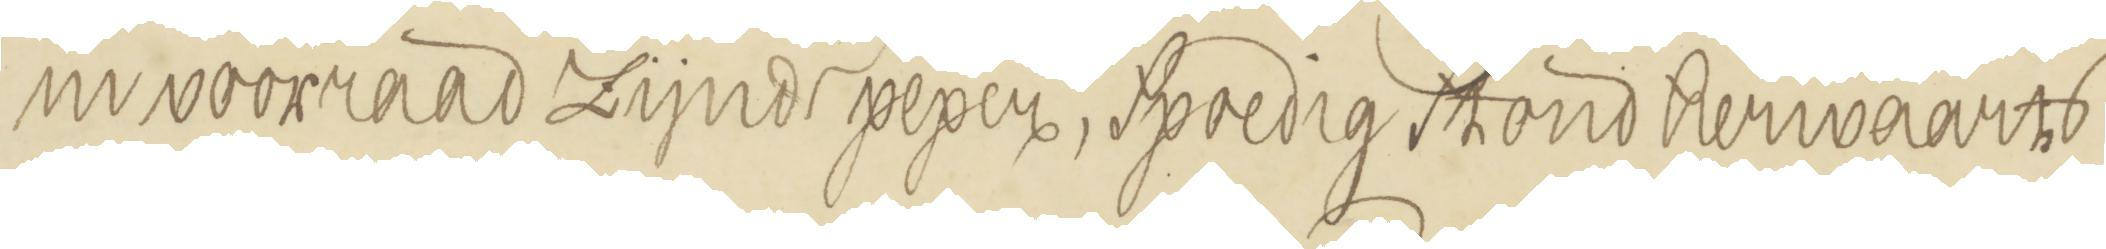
in voorraad zijnde peper, spoedig stond herwaarts
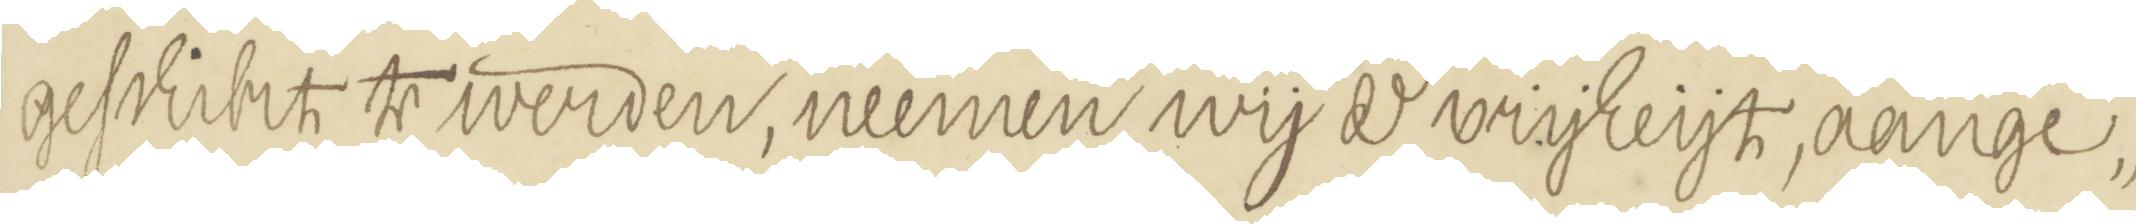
geschikt te werden, neemen wij de vrijheijt, aange,
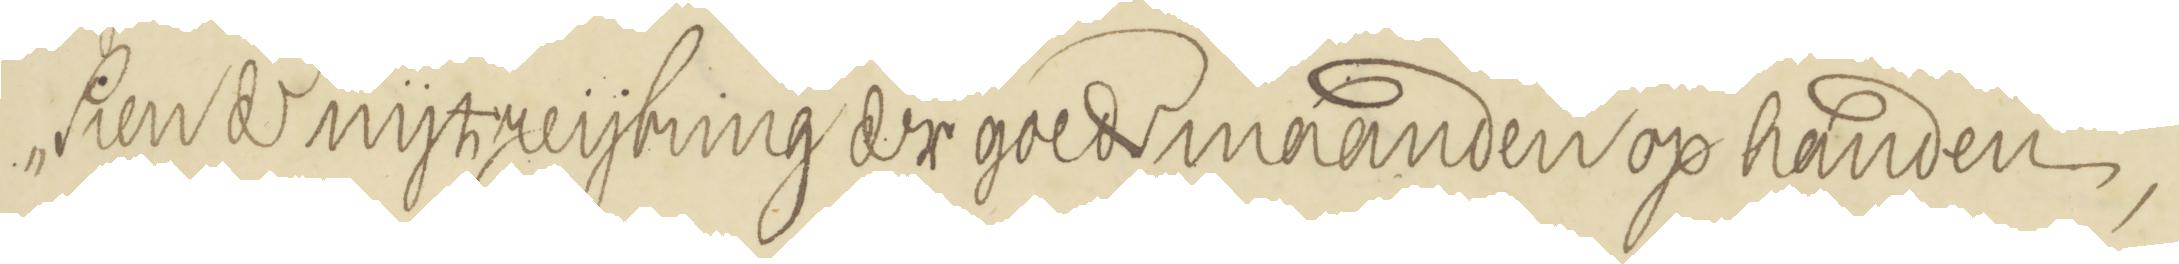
„sien de uijtreijking der goede maanden op handen,
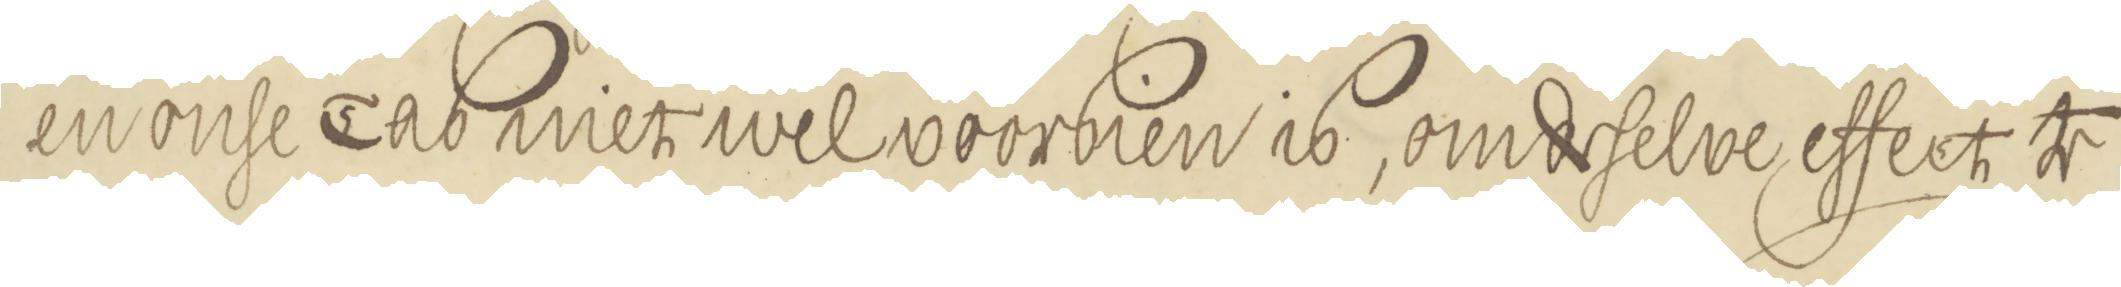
en onse cas niet wel voorsien is, om deselve effect te
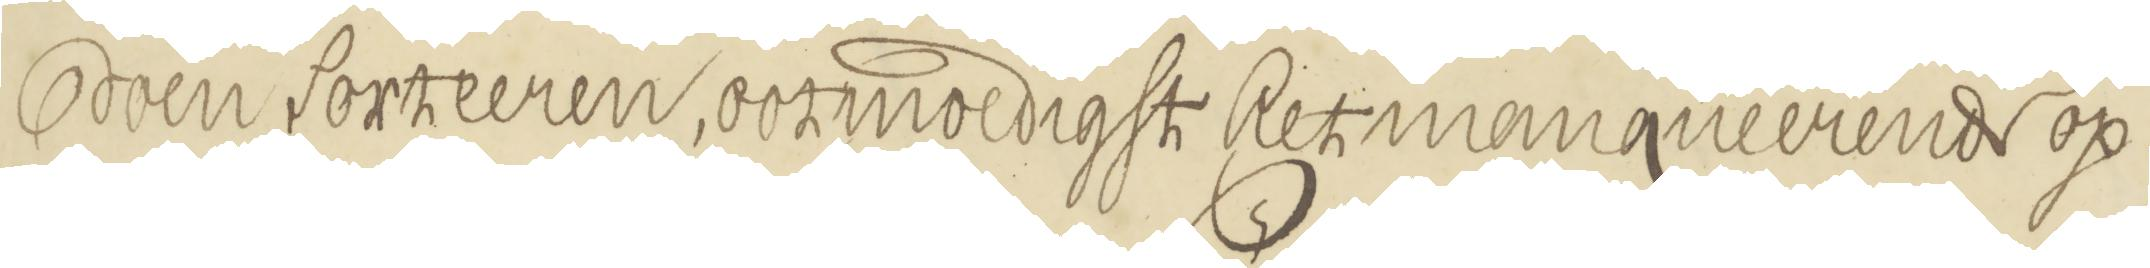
doen sorteeren, ootmoedigst het manqueerende op
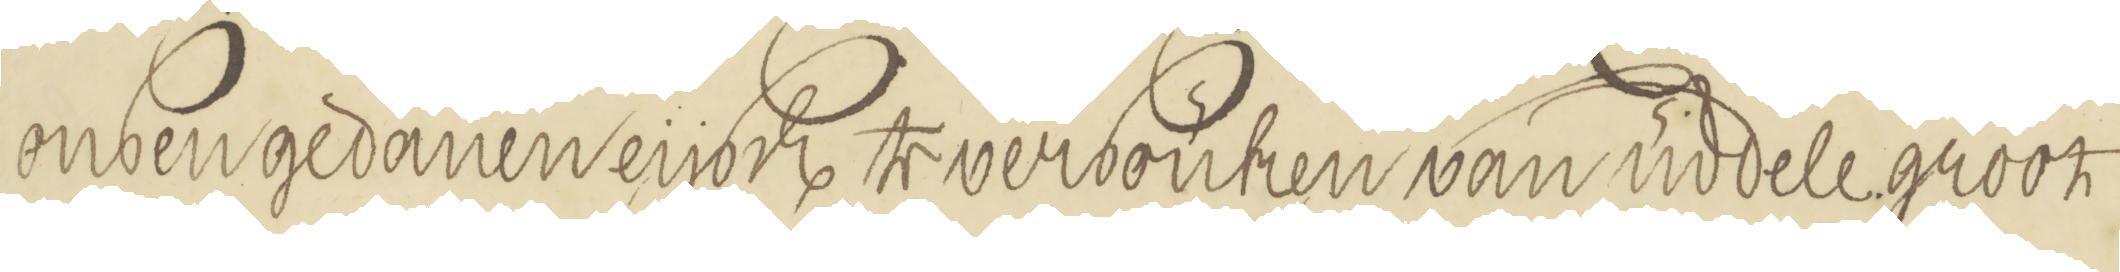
onsen gedanen eijsch te versouken van uedele groot
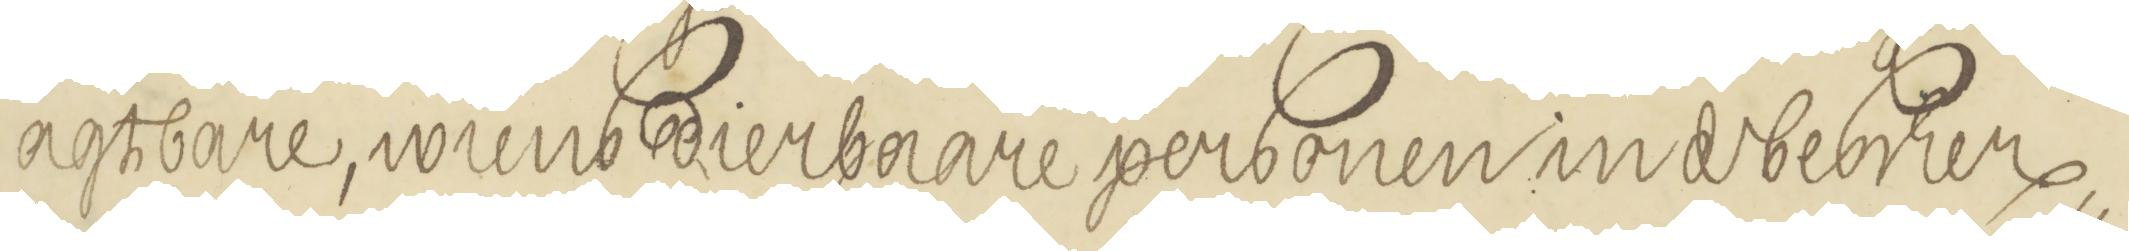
agtbare, wiens dierbaare personen in de bescher„
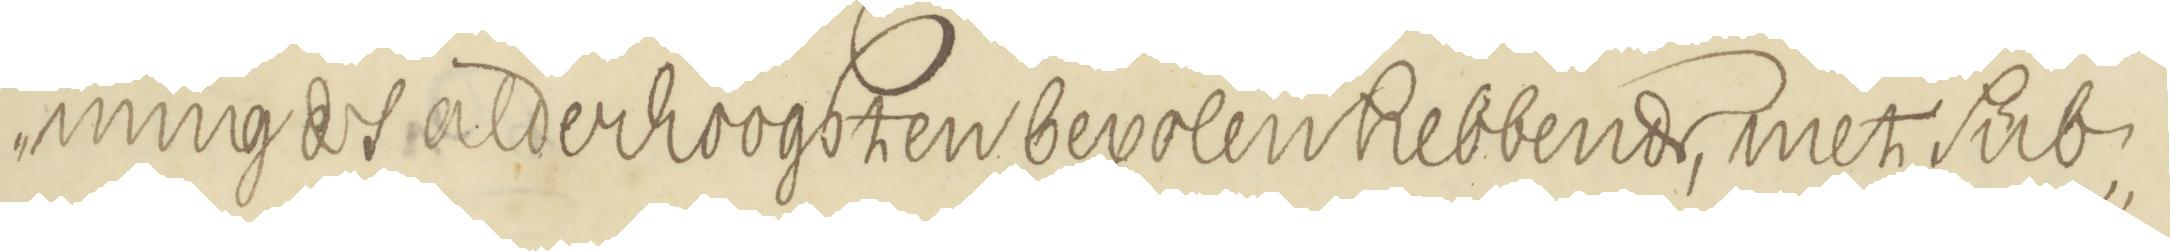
„ming des alderhoogsten bevolen hebbende, met sub„
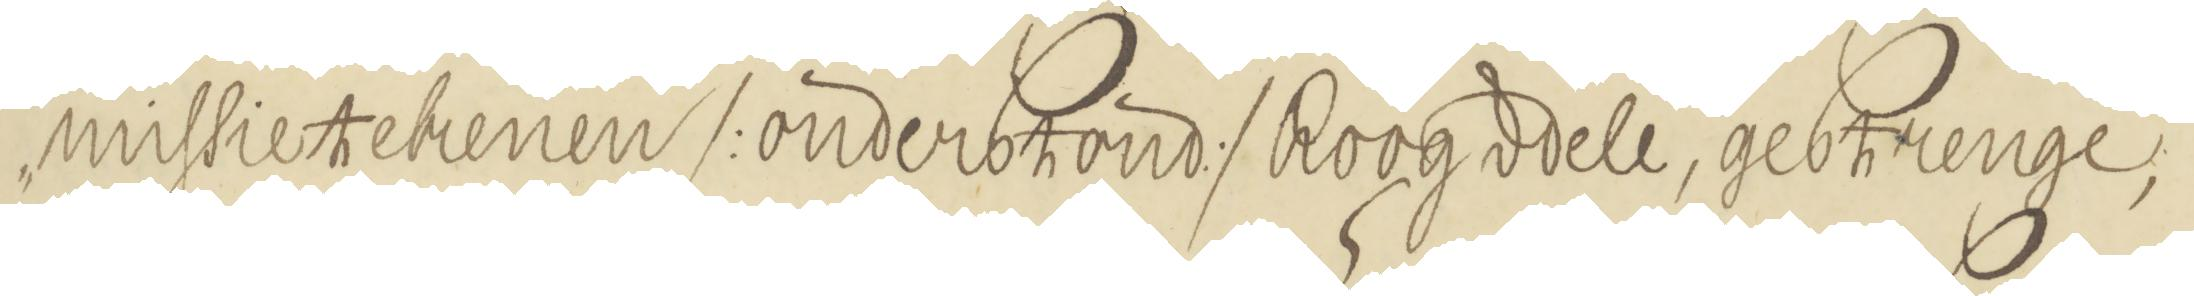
„missie tekenen /:onderstond:/ hoog edele, gestrenge,
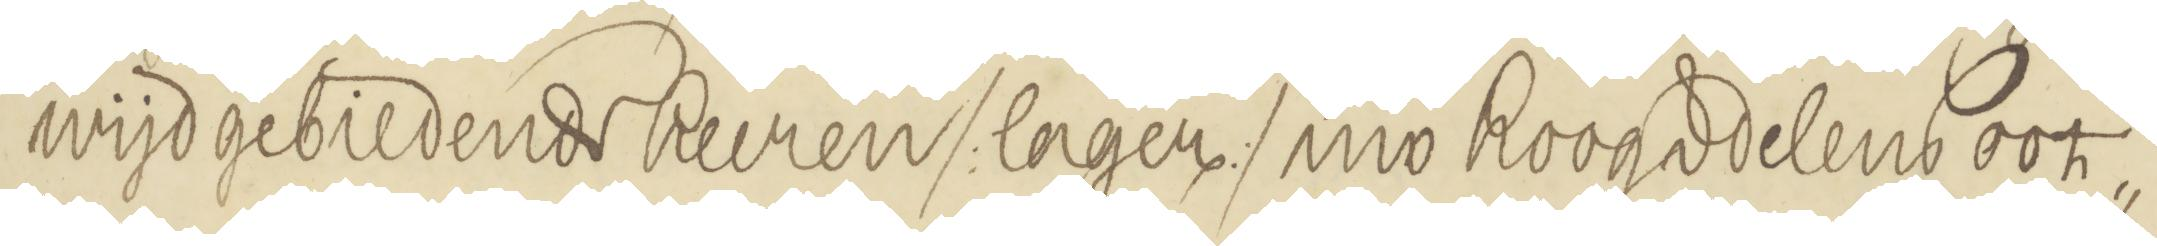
wijd gebiedende heeren /:lager:/ uw hoog edelens oot„
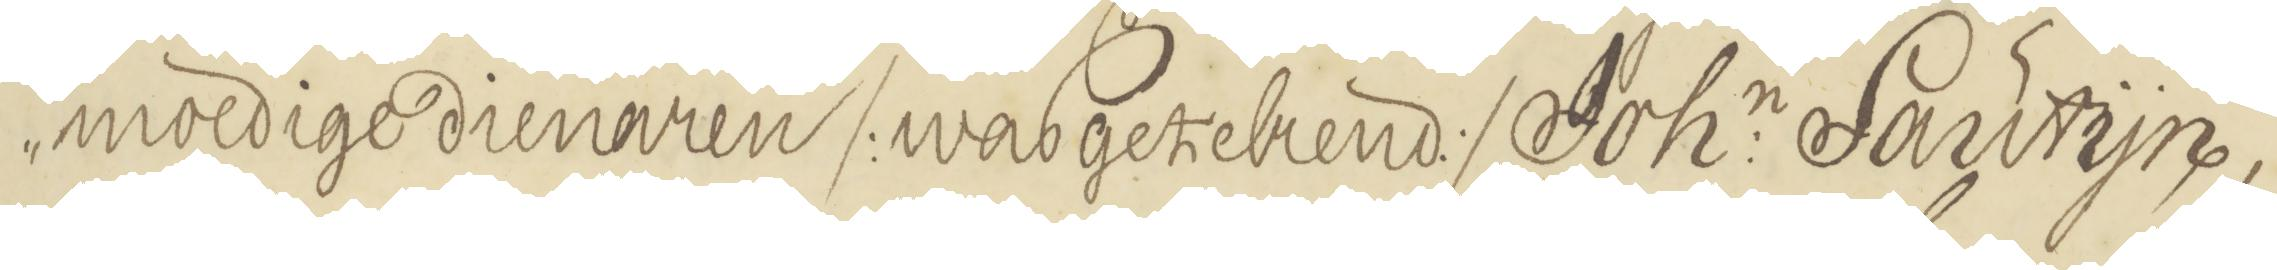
„moedige dienaren /:was getekend:/ Ioh:n Sautijn,
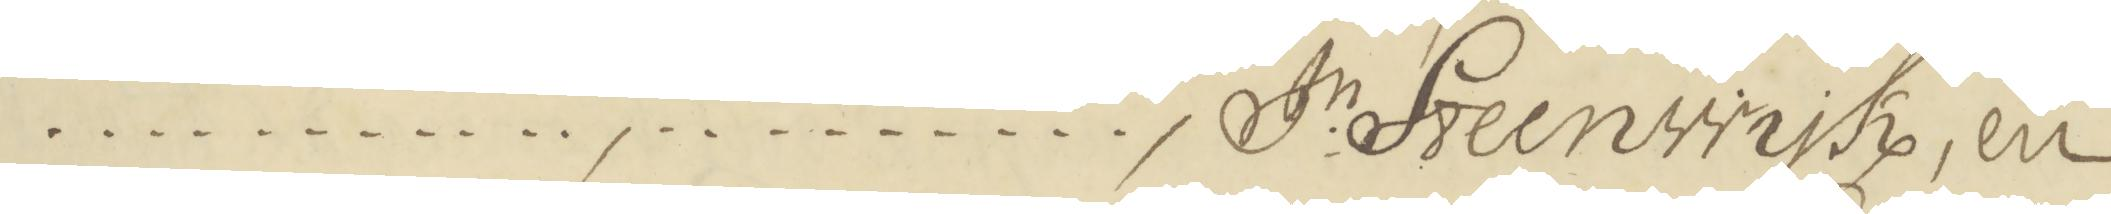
- - - - - - - - - - , - - - - - - - - , I:n Steenwijk, en
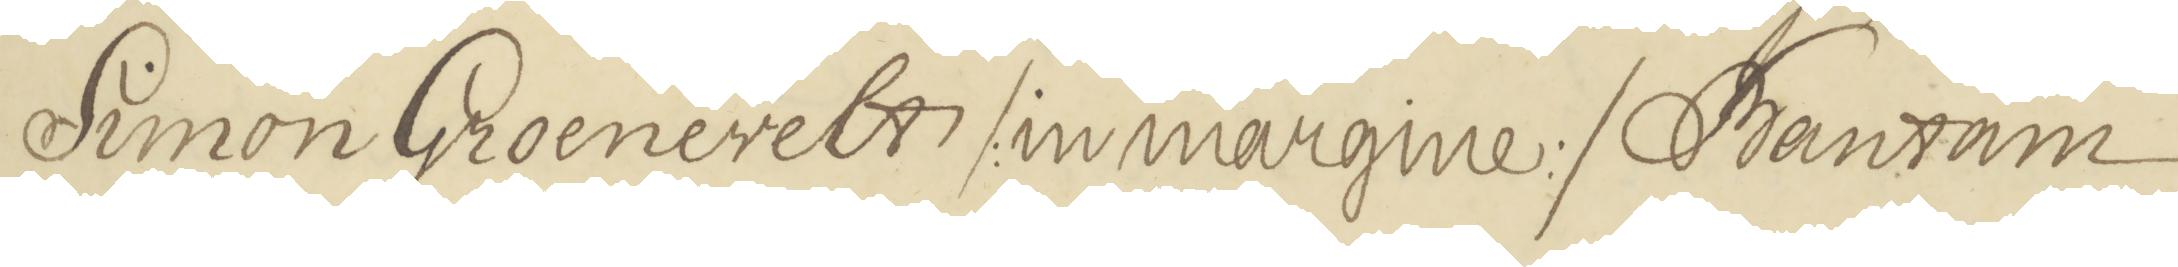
Simon Groenevelt /:in margine:/ Bantam
